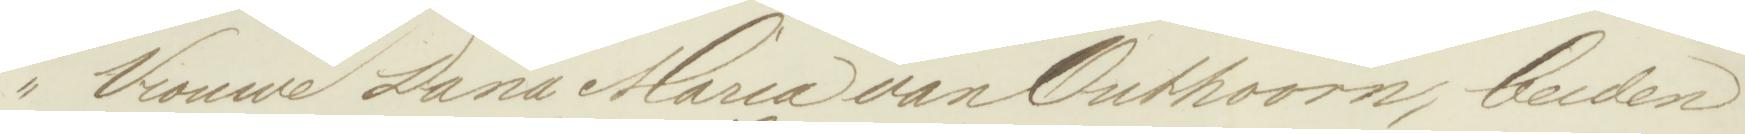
„ Vrouwe Dana Maria van Outhoorn, beiden
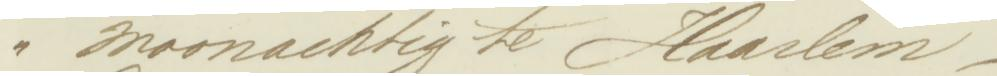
„ woonachtig te Haarlem
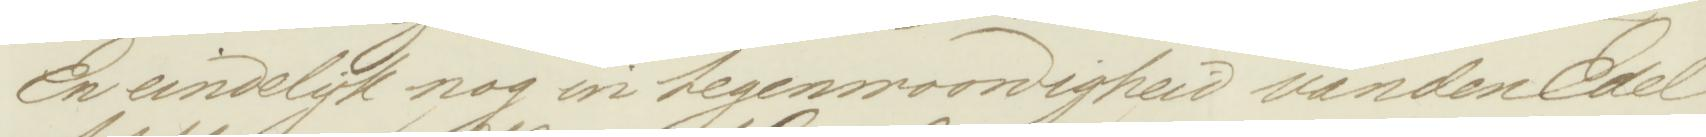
En eindelijk nog in tegenwoordigheid van den Edel
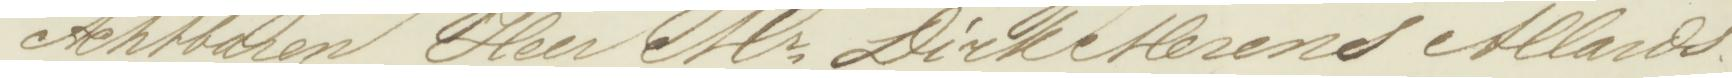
Achtbaren Heer M„r Dirk Merens Allards.
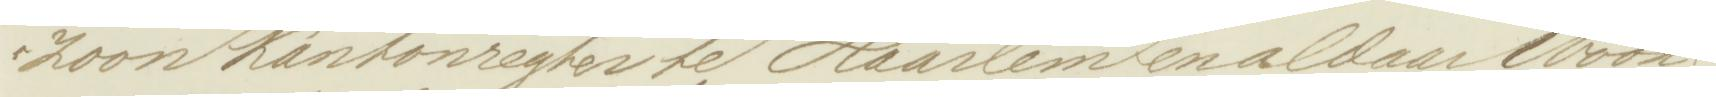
„zoon Kantonregter te Haarlem en aldaar woon.
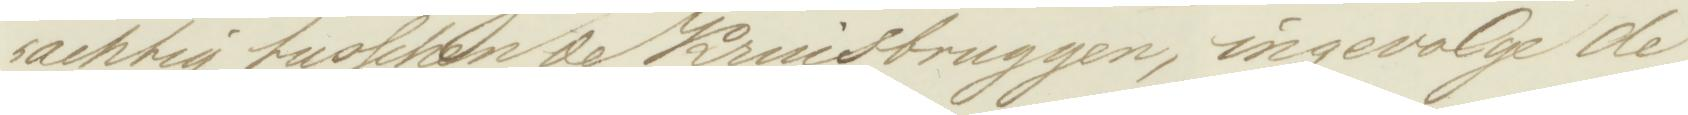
achtig tusschen de Kruisbruggen, ingevolge de
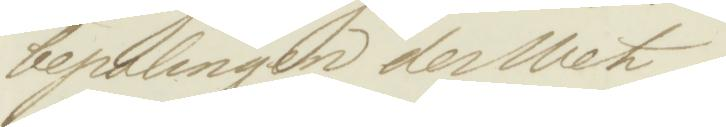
bepalingen der Wet
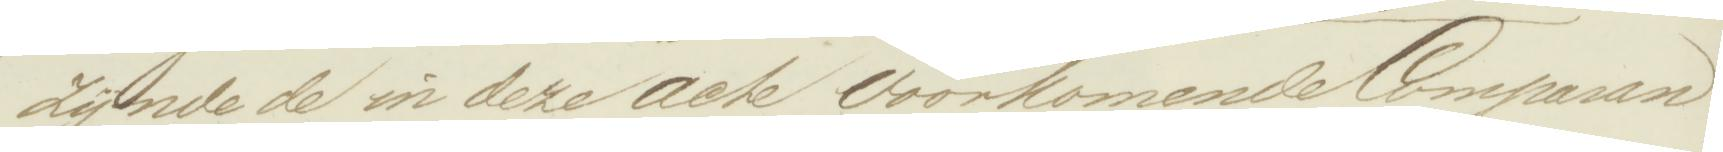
Zijnde de in deze acte voorkomende Comparan
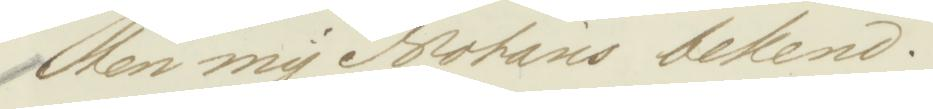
ten mij Notaris bekend.
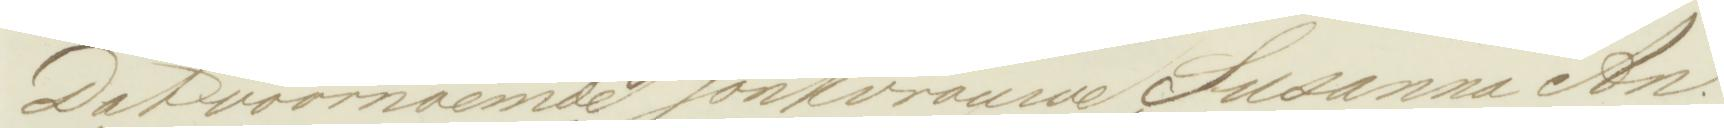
Dat voornoemde Jonkvrouwe Susanna An:
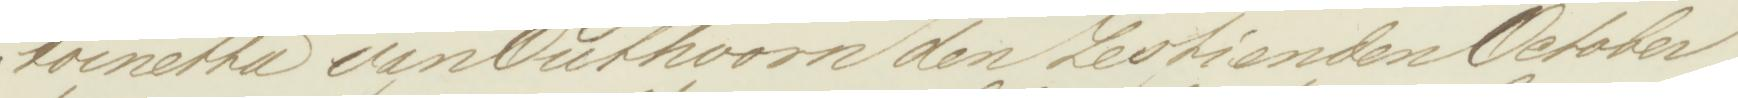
toinetta van Outhoorn den Zestienden October
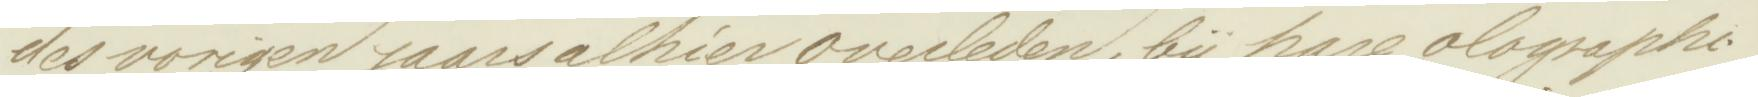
des vorigen jaars alhier overleden, bij hare olographi.
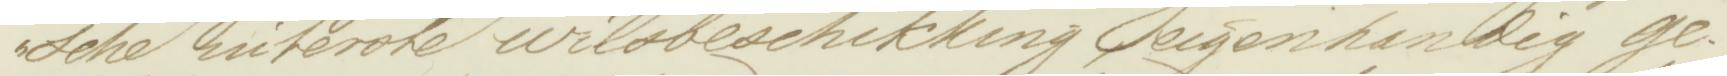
„sche uiterste wilsbeschikking, eigenhandig ge.
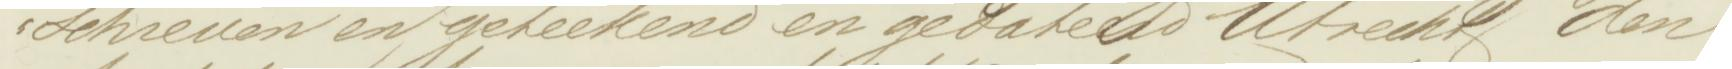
„schreven en geteekend en gedateerd Utrecht den
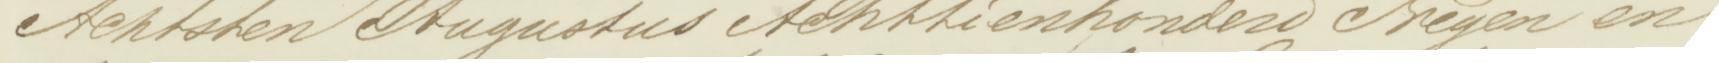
Achtsten Augustus Achttienhonderd Negen en
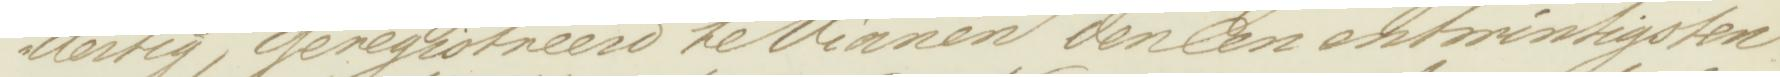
„dertig, geregistreerd te Vianen den Een entwintigsten
